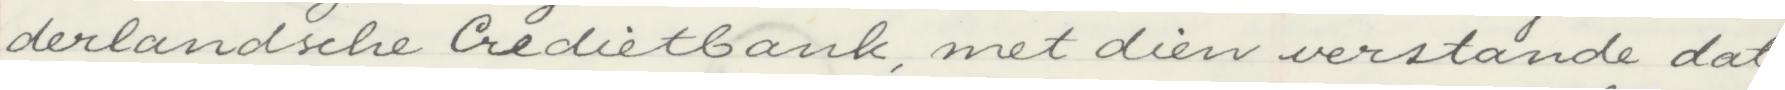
derlandsche Credietbank, met dien verstande dat
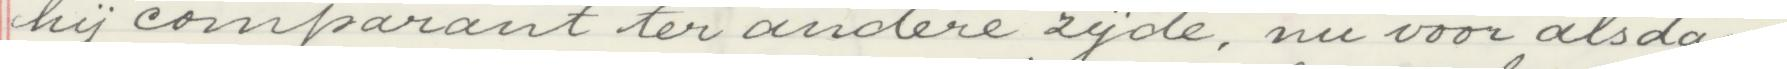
hij comparant ter andere zijde, nu voor als dan
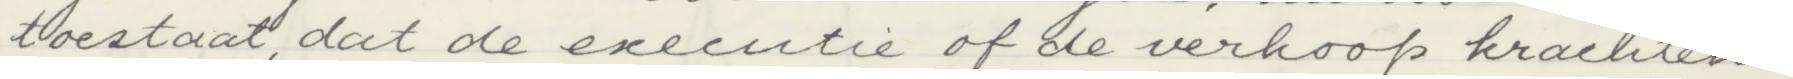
toestaat, dat de executie of de verkoop krachtens
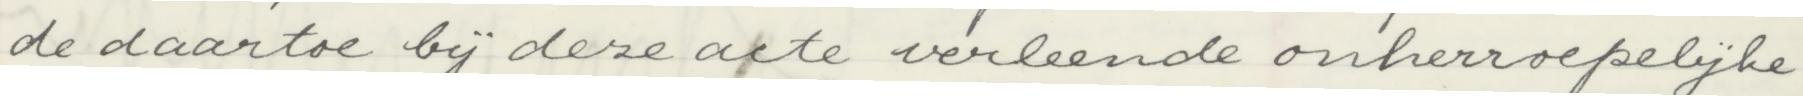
de daartoe bij deze acte verleende onherroepelijke
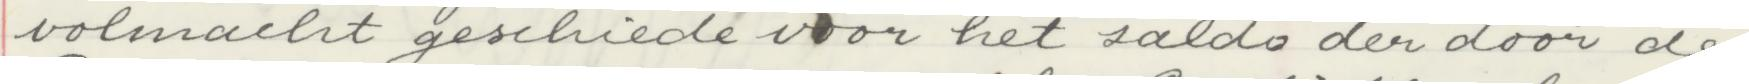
volmacht geschiede voor het saldo der door de
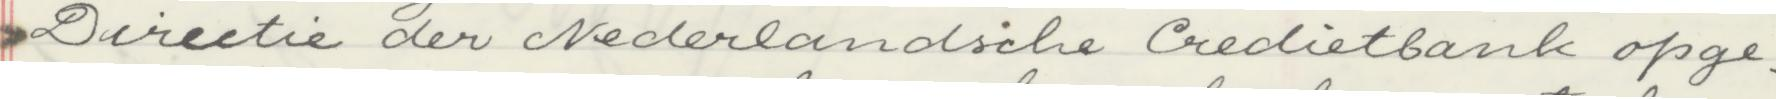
Directie der Nederlandsche Credietbank opge
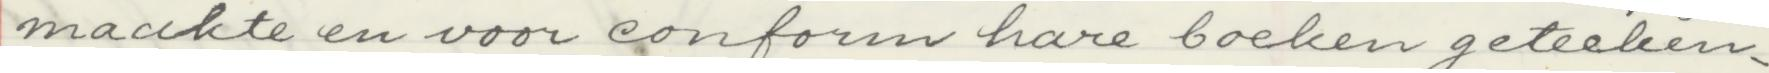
maakte en voor conform hare boeken geteeken
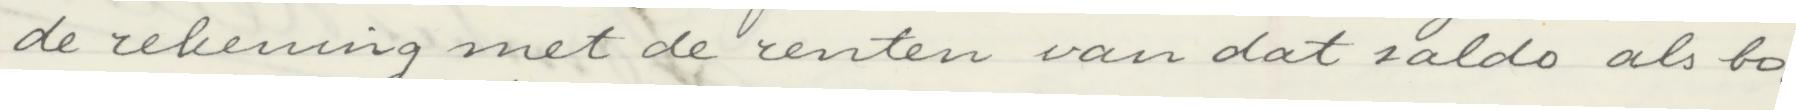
de rekening met de renten van dat saldo als bo
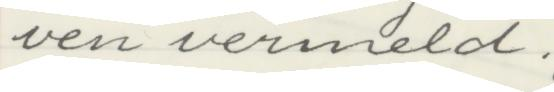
ven vermeld
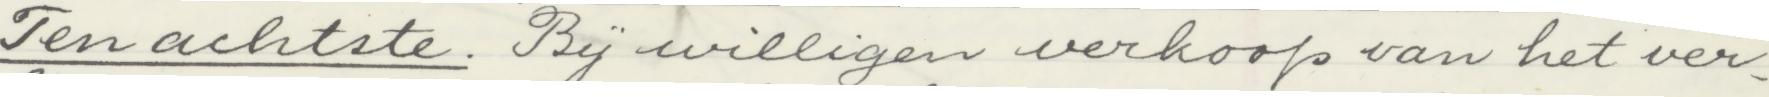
Ten achtste. Bij willigen verkoop van het ver
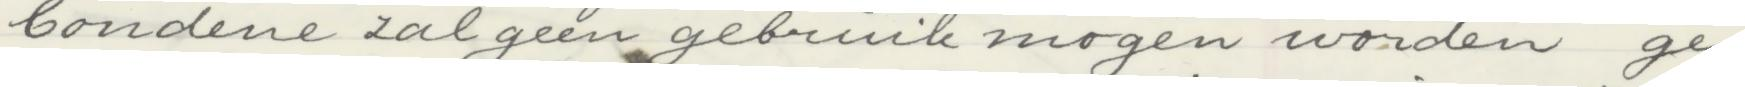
bondene zal geen gebruik mogen worden ge
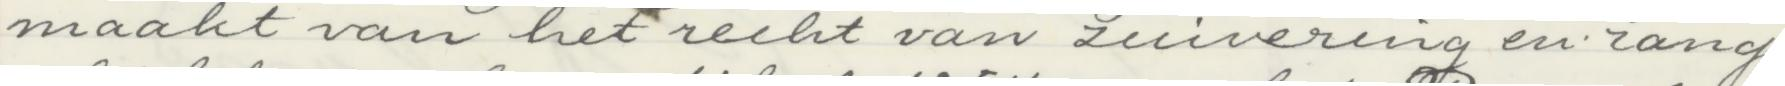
maakt van het recht van zuivering en rang
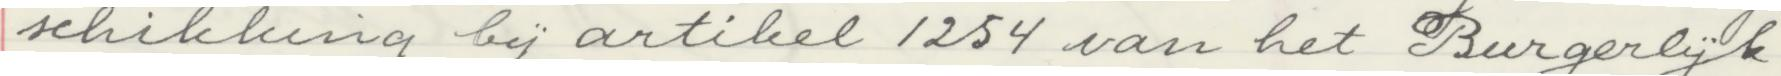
schikking bij artikel 1254 van het Burgerlijk
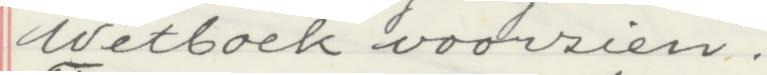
Wetboek voorzien
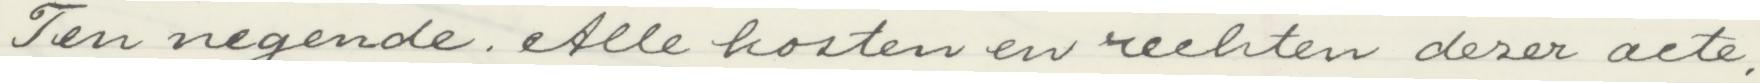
Ten negende. Alle kosten en rechten dezer acte
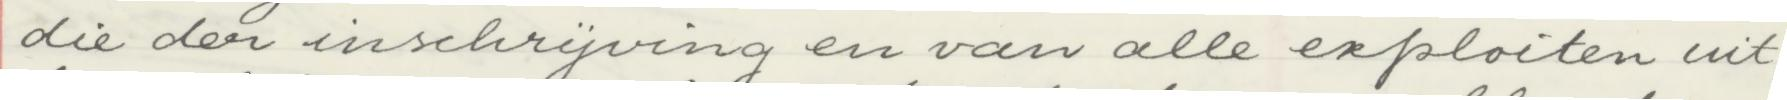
die der inschrijving en van alle exploiten uit
